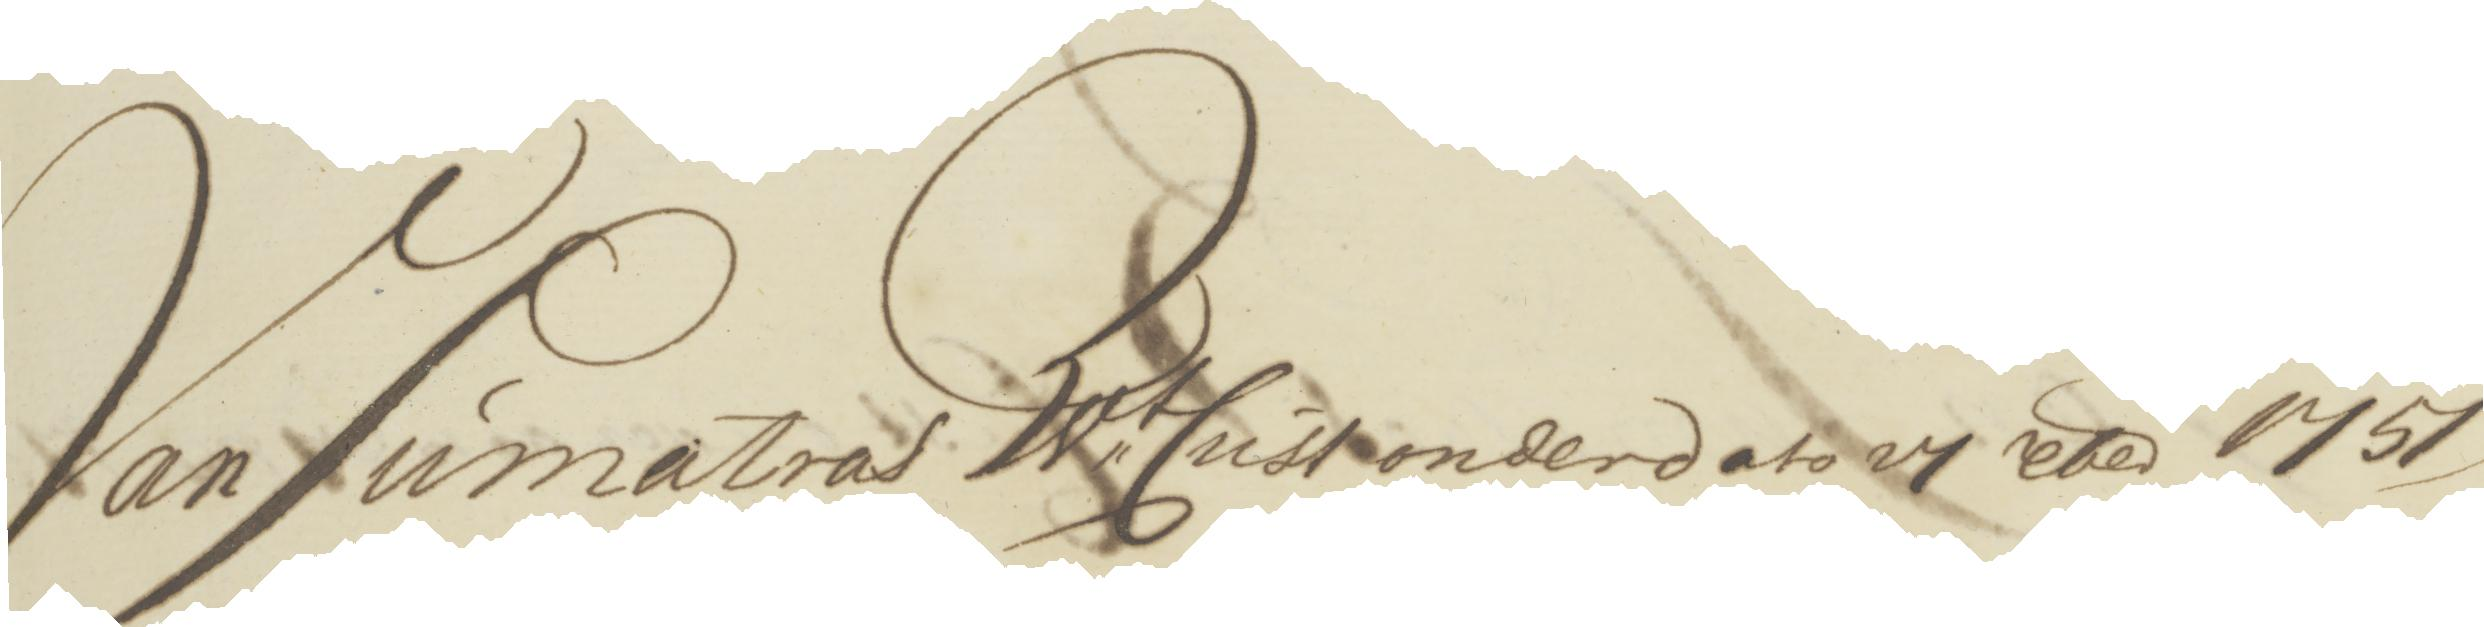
Van Sumatras W„t Cust onderdato 27 xber 1757
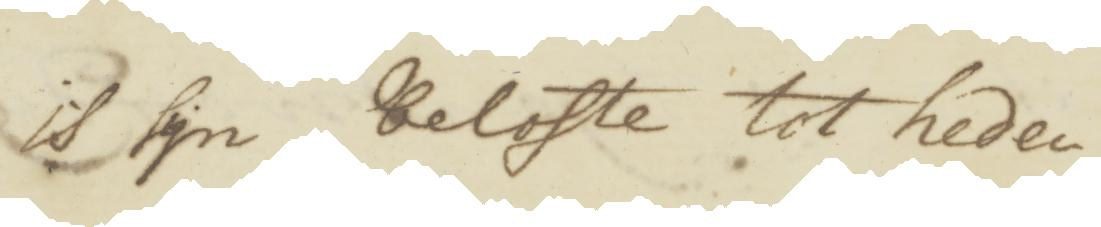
is sijn belofte tot hede
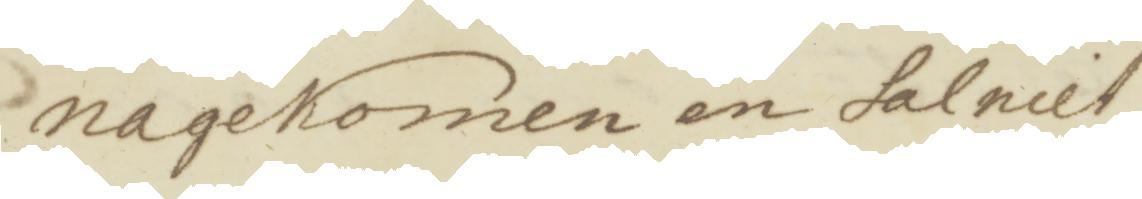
nagekomen en sal niet
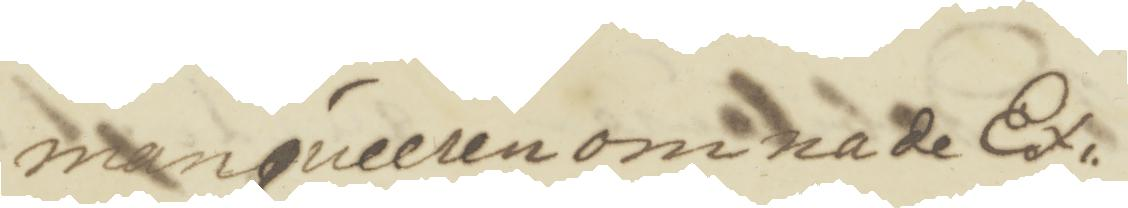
manqueeren om na de de Ex„
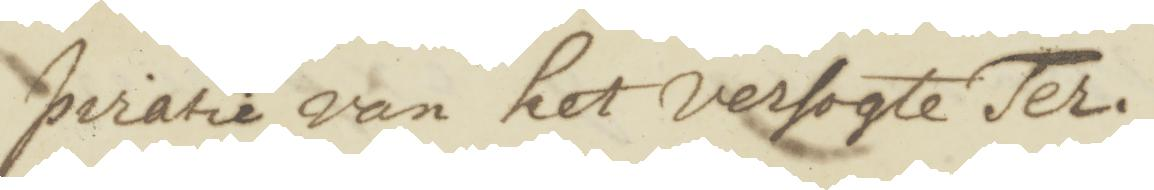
piratie van het versogte Ter„
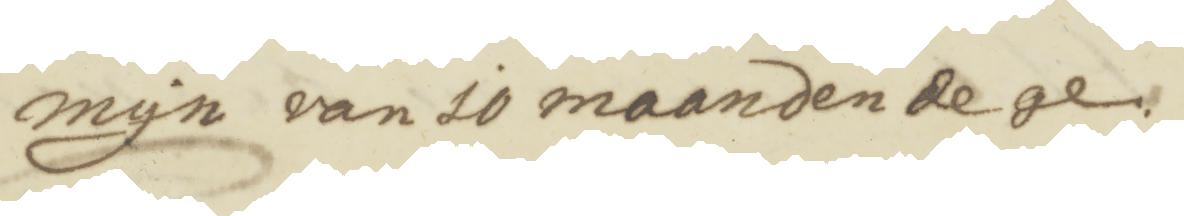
mijn van 10 maanden de ge„
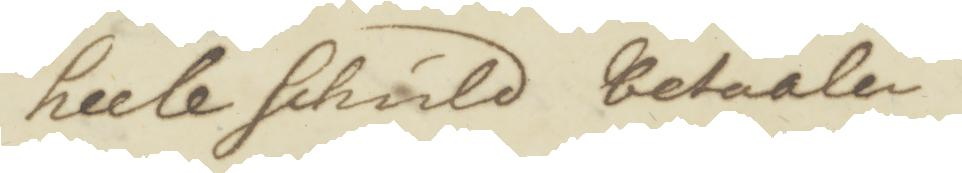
heele schuld betaalen
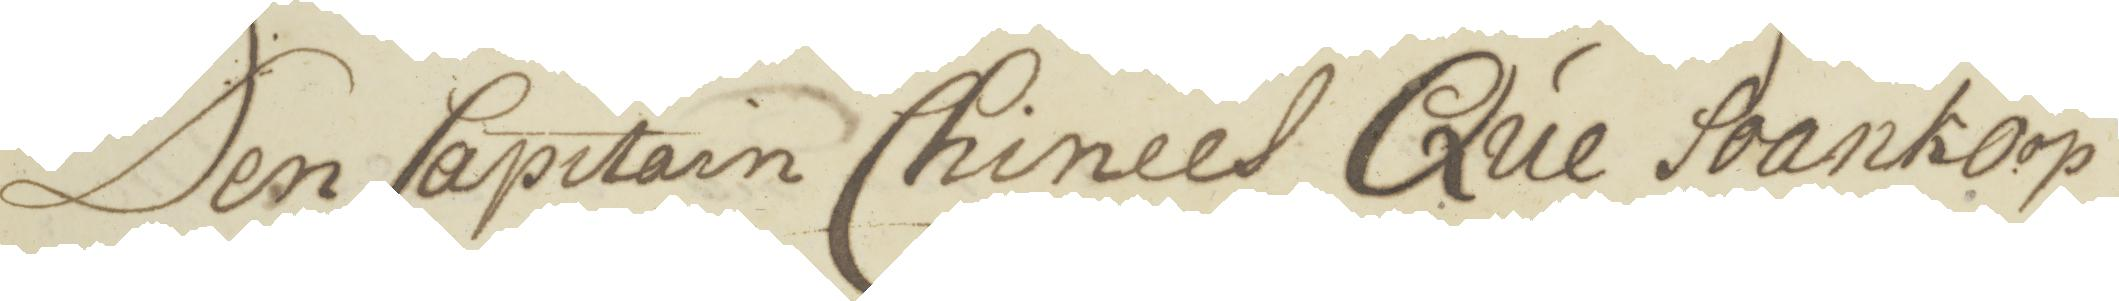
Den Capitain Chinees Que Toanko op
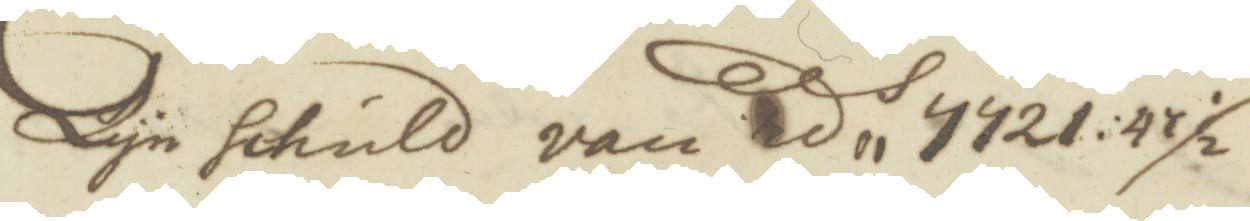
zijn schuld van rd„s 7721: 47½
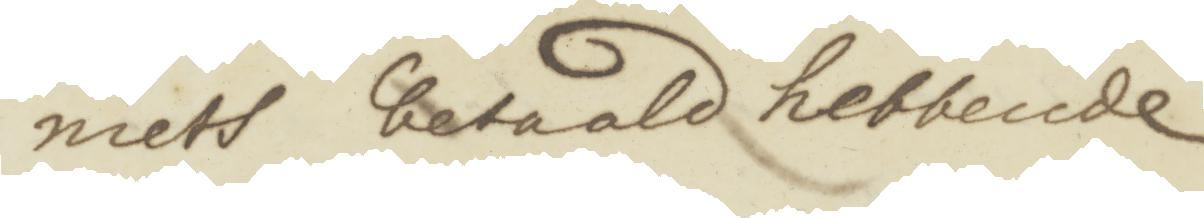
niets betaald hebbende
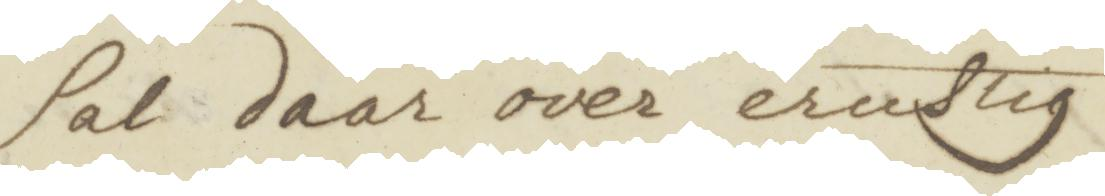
sal daar over erustig
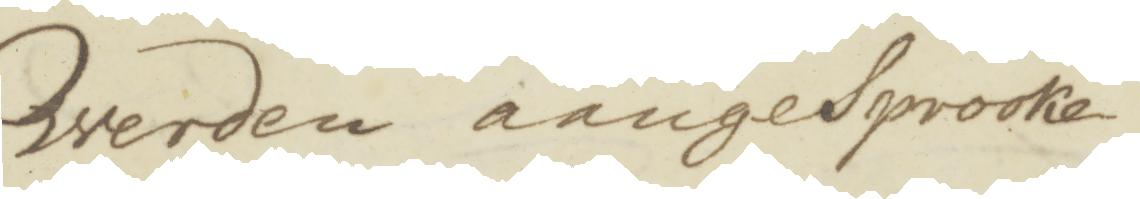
werden aangesprooke
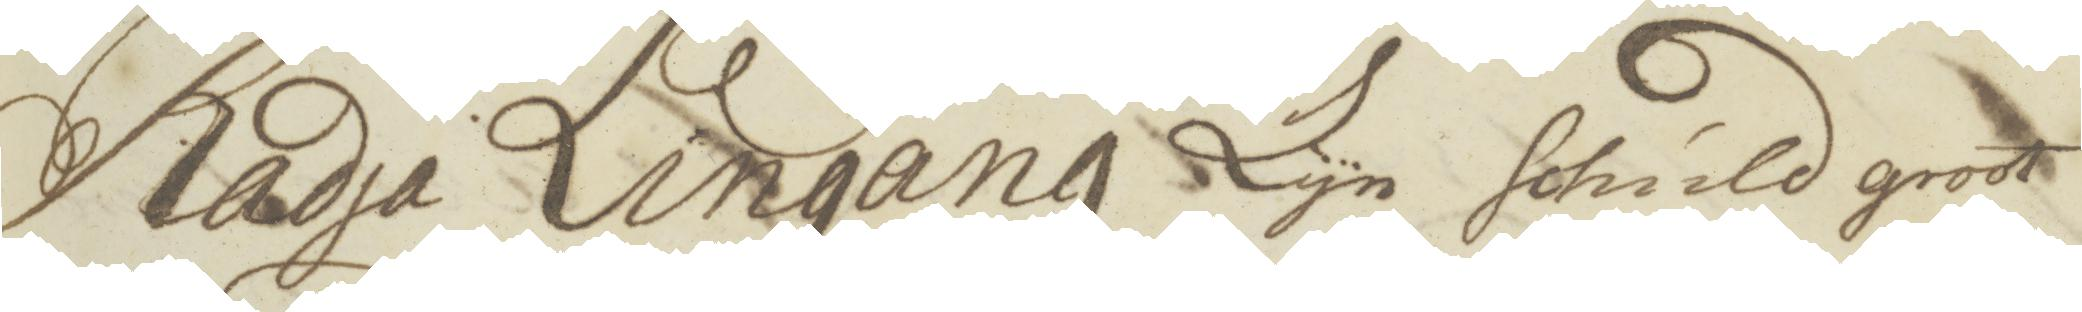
Radja Lingang Zijn schuld groot
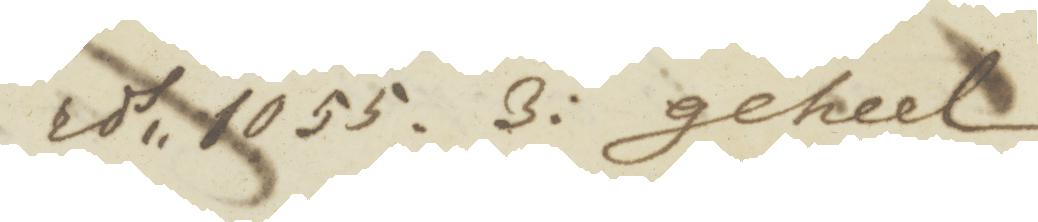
rd„s 1055. 3: geheel
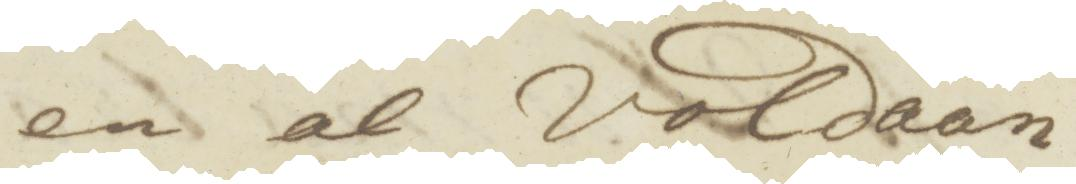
en al voldaan
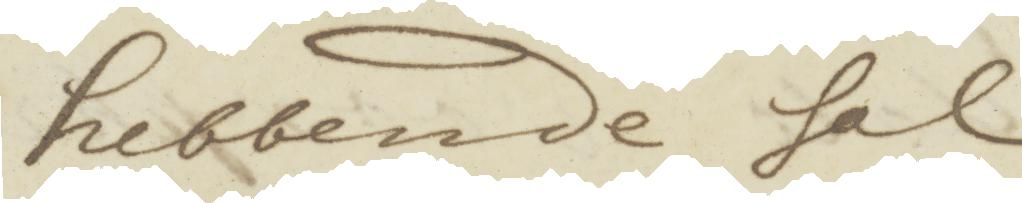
hebbende sal
